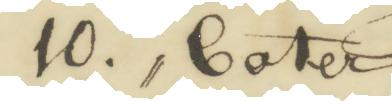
10. „ boter
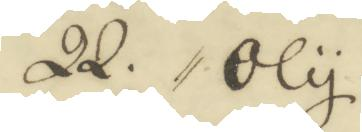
22. „ Olij
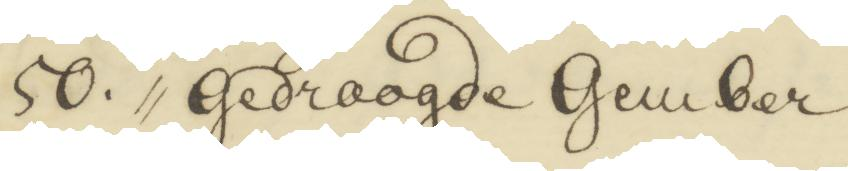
50. „ gedroogde Gember
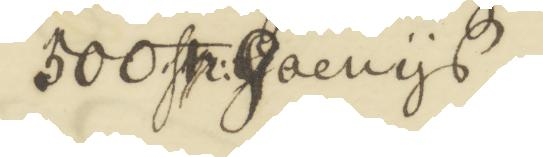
500 str: Goenijs _
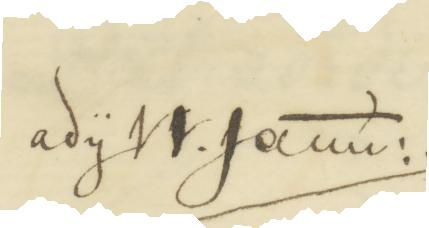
adij 11. Janu:
